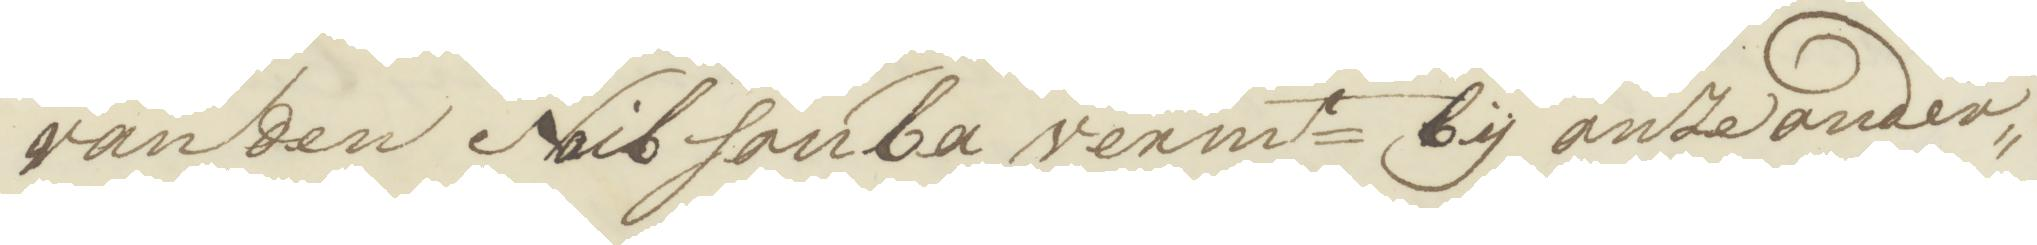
van den Naib Souba verm=t bij onze onder„
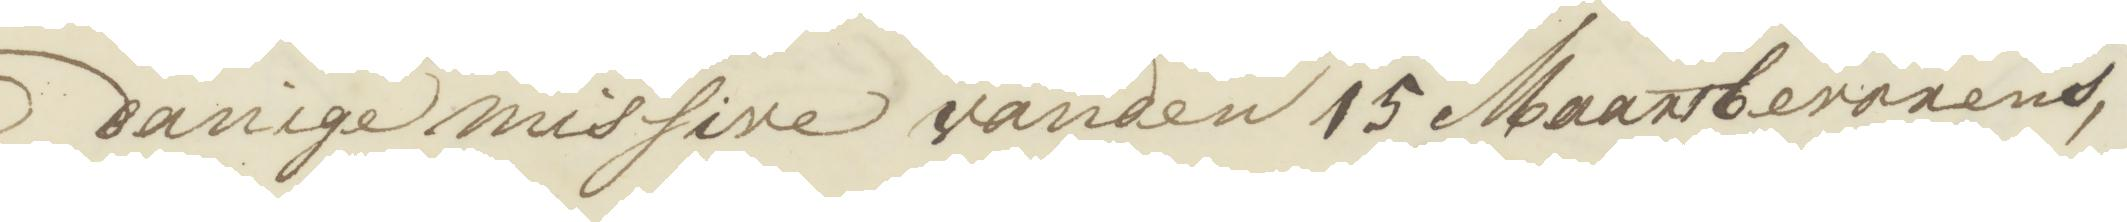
danige missive van den 15 Maart bevorens,
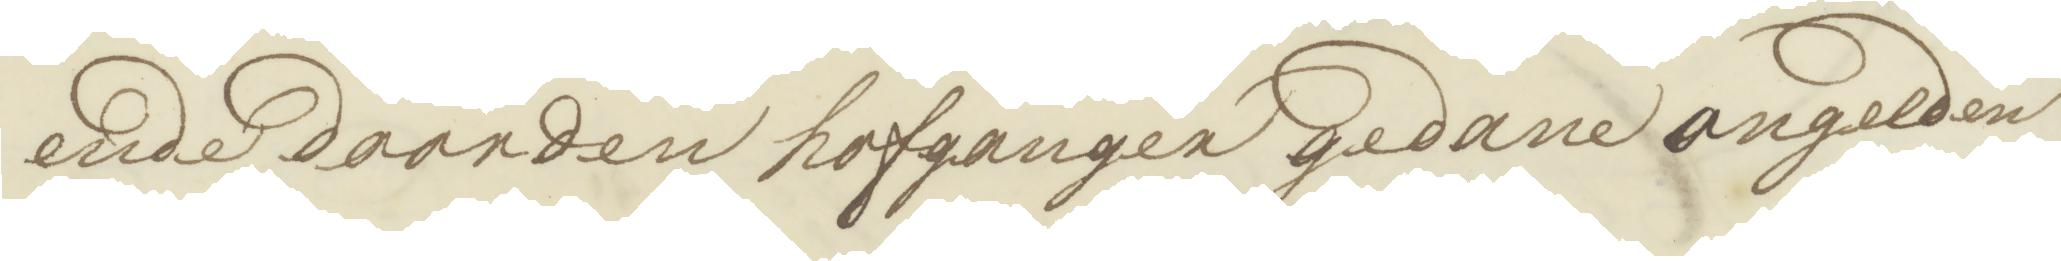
ende door den hofganger gedane ongelden
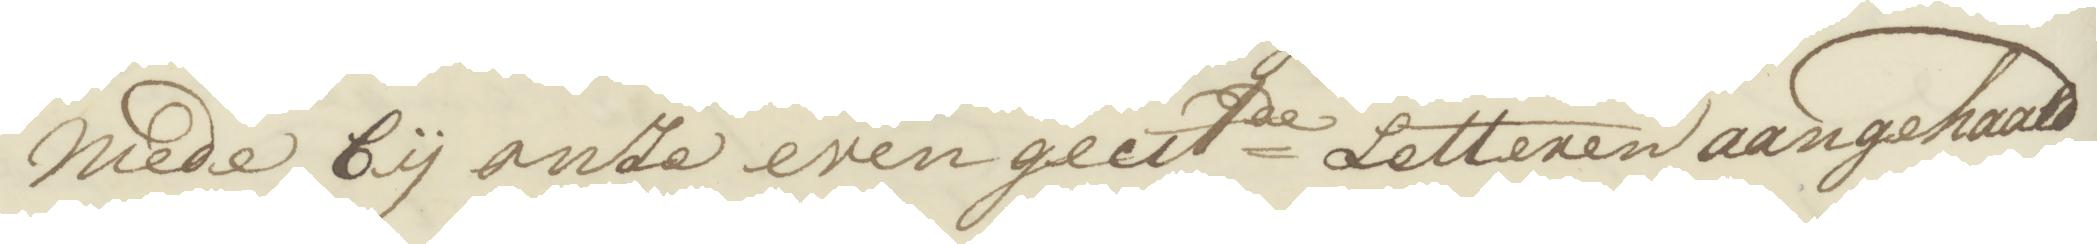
Mede bij onze even gecit=de Letteren aangehaald
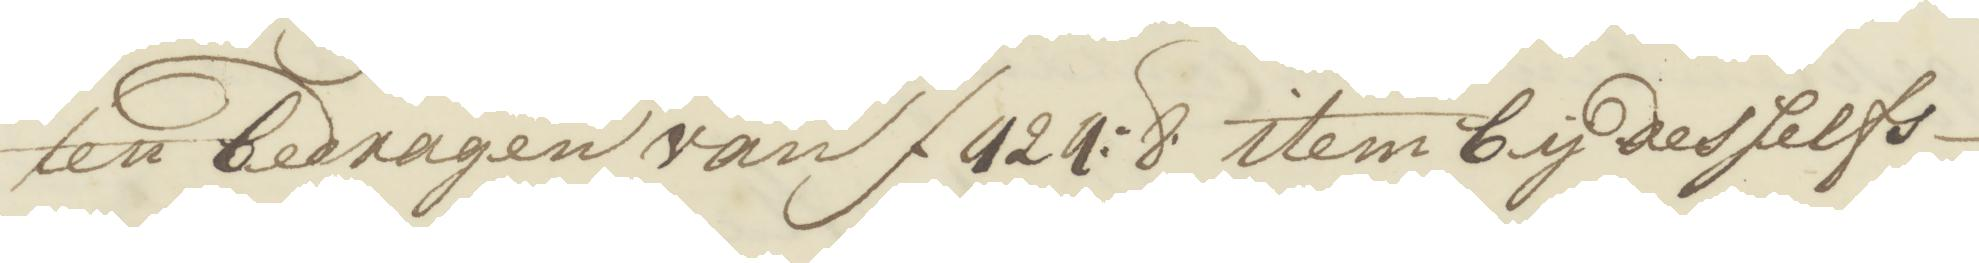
ten bedragen van ƒ424:8: item bij desselfs —
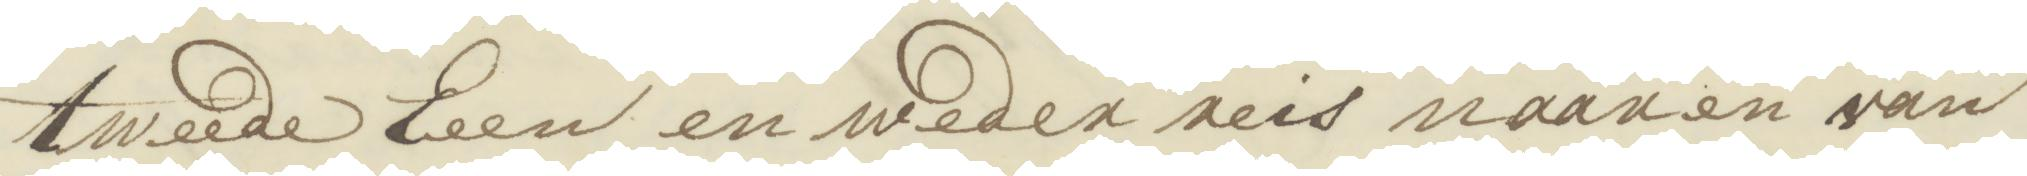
tweede heen en weder reis naar en van
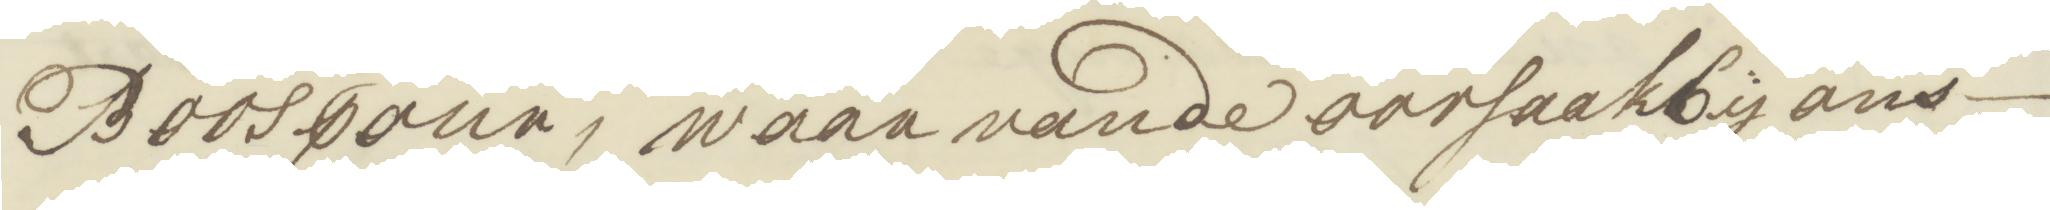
Boospour, waar van de oorsaak bij ons —
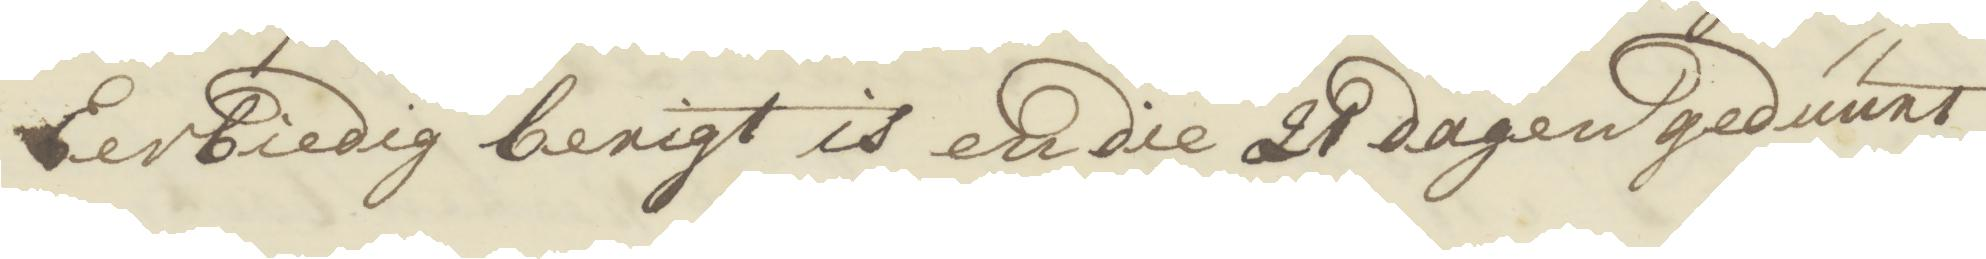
Eerbiedig berigt is en die 21 dagen geduurt
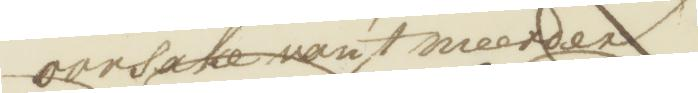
oorsake van 't meerder
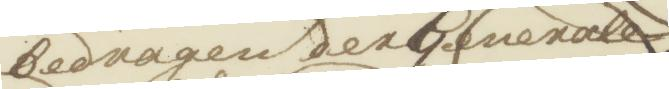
bedragen der Generale
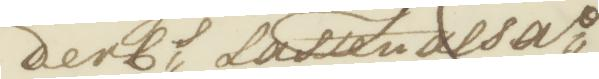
derb„s Lasten als a„o
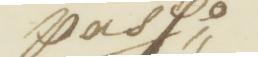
pass„o
